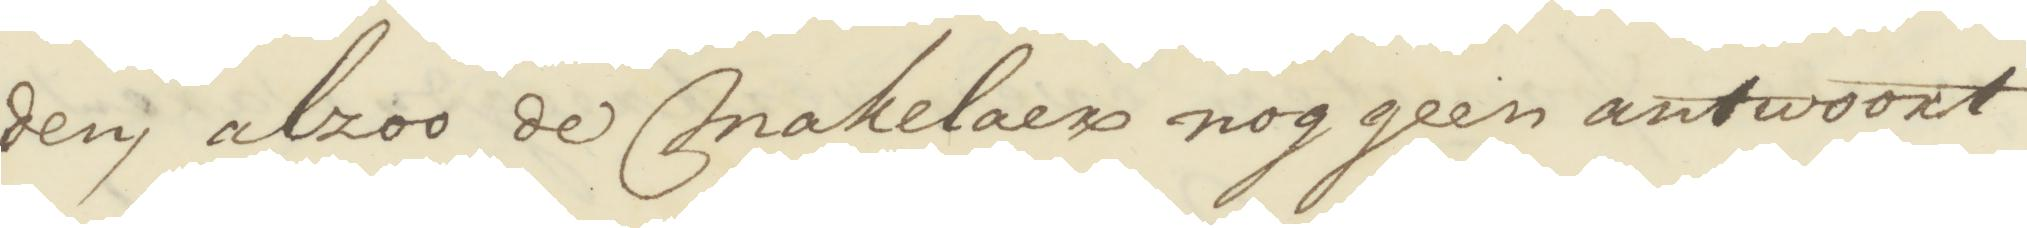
den, alzoo de Makelaer nog geen antwoort
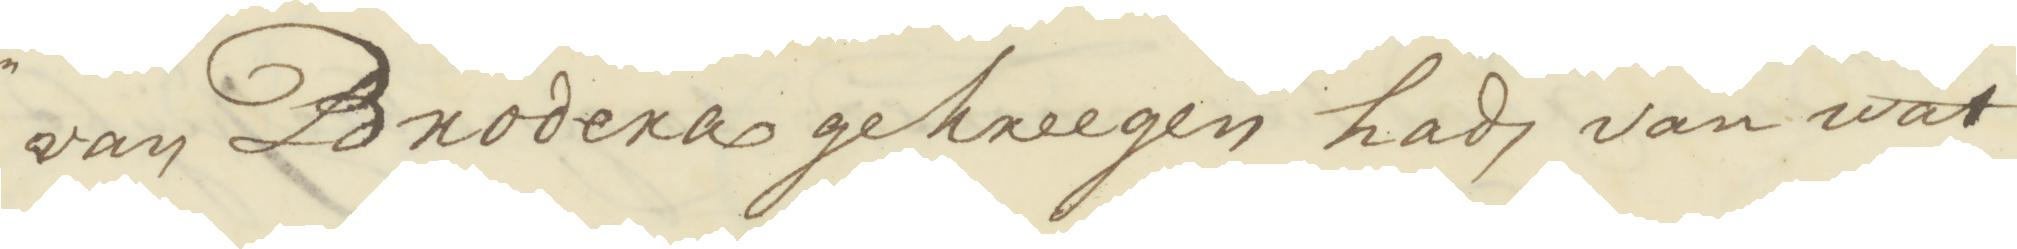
van Brodera gekreegen had, van wat
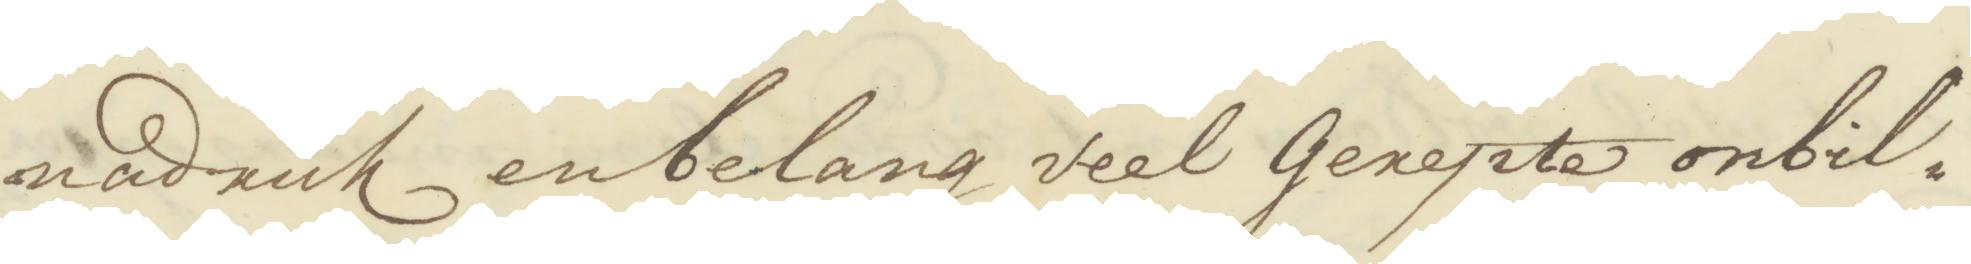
nadruk en belang veel Gerepte onbil„
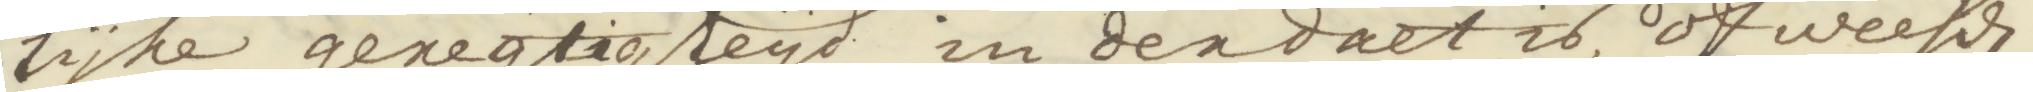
lijke geregtigheijd in derdaet is, of wesen
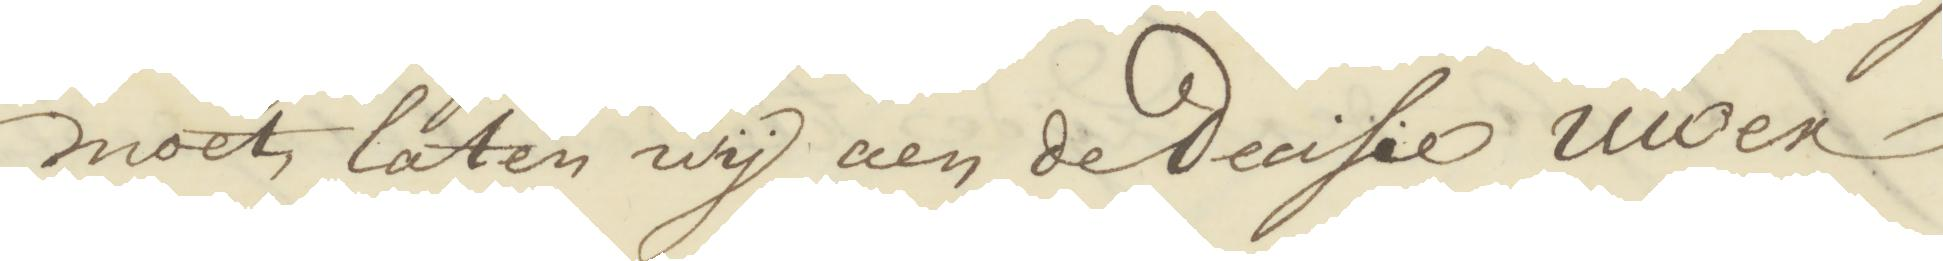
Moet laten wij aen de Decisie uwer
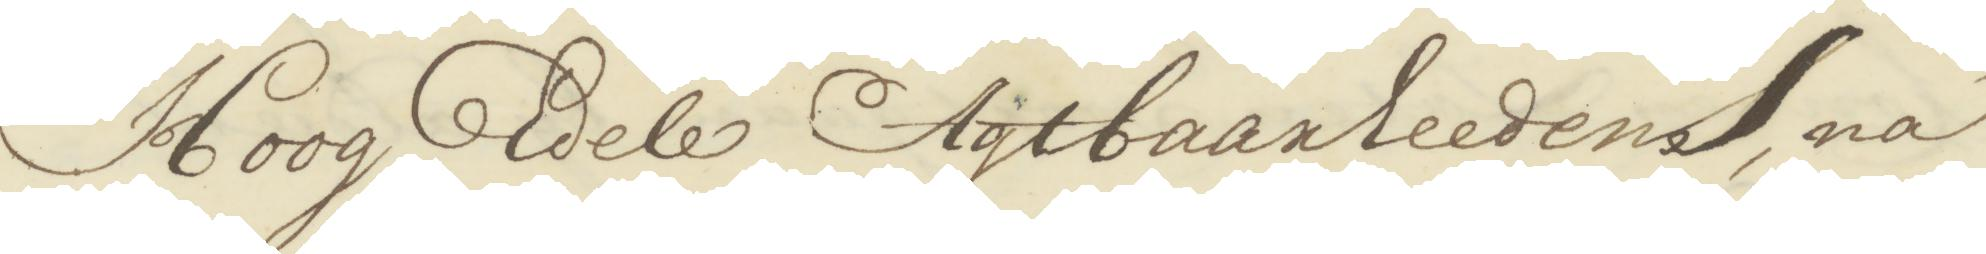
Hoog Edele Agtbaarheedens, na
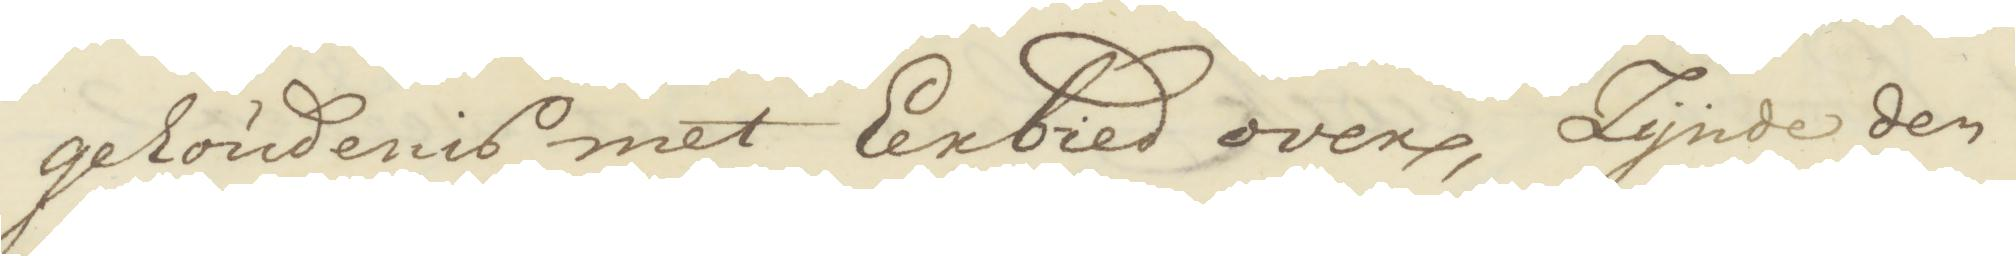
gehoudenis met Eerbied over, zijnde den
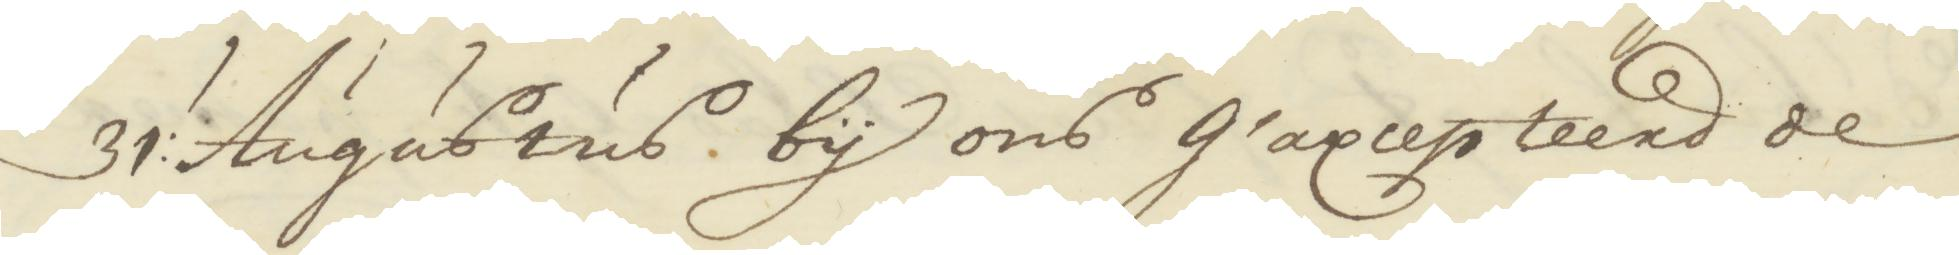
31: Augustus bij ons G’axcepteerd de
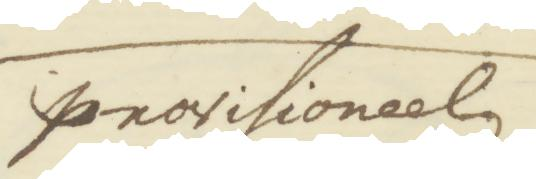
provisioneel
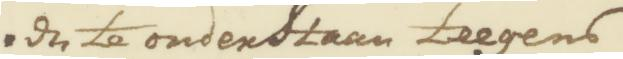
en te onder Staan teegens
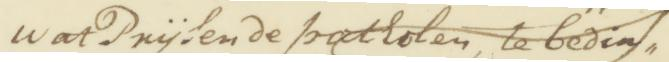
wat Prijsen de patholen, te bedin„
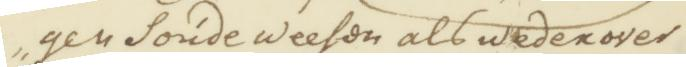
„gen soude weesen als weder over
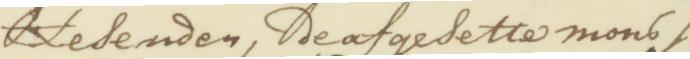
tesenden, de afgesette mons
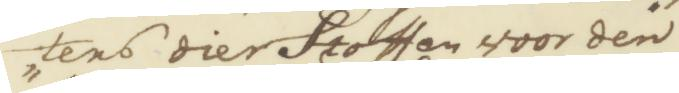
„ters dier Stoffen voor den
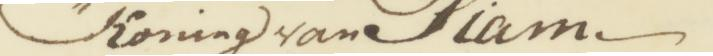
Koning van Siam
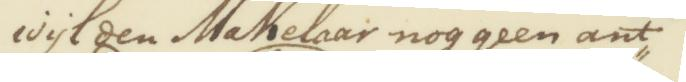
wijl den Makelaar nog geen ant„
